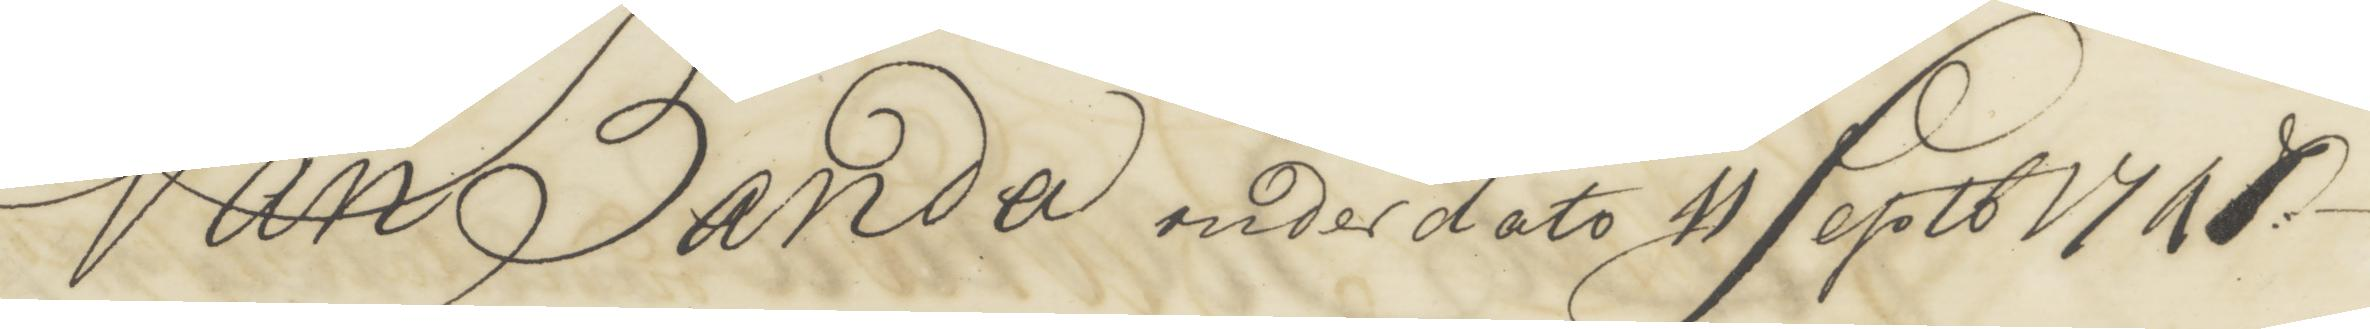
Van Banda onder dato 11 Septb 1747.-
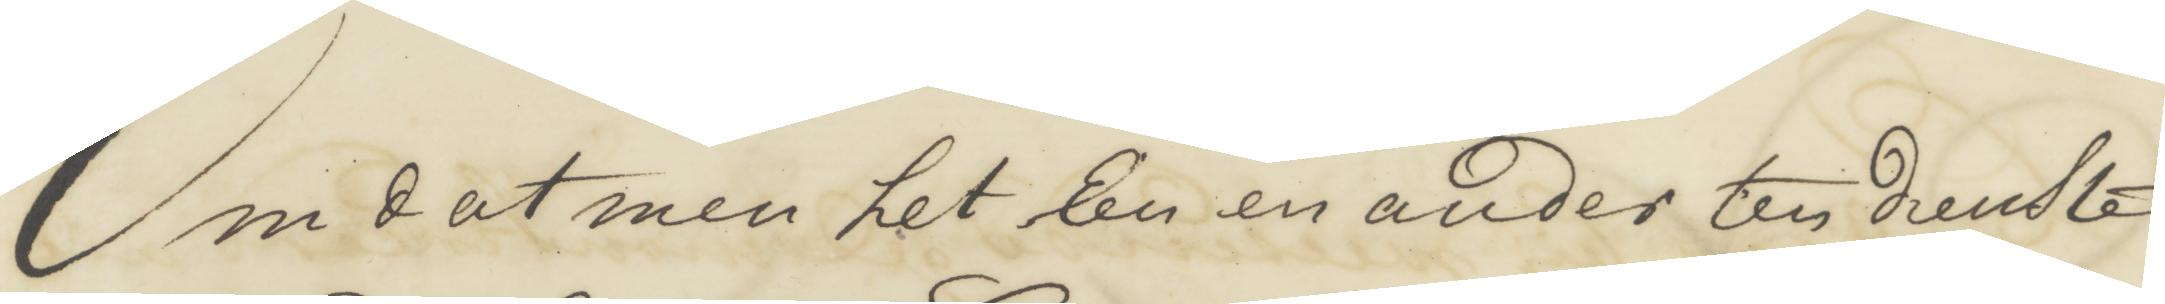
Om dat men het Een en ander ten dienste
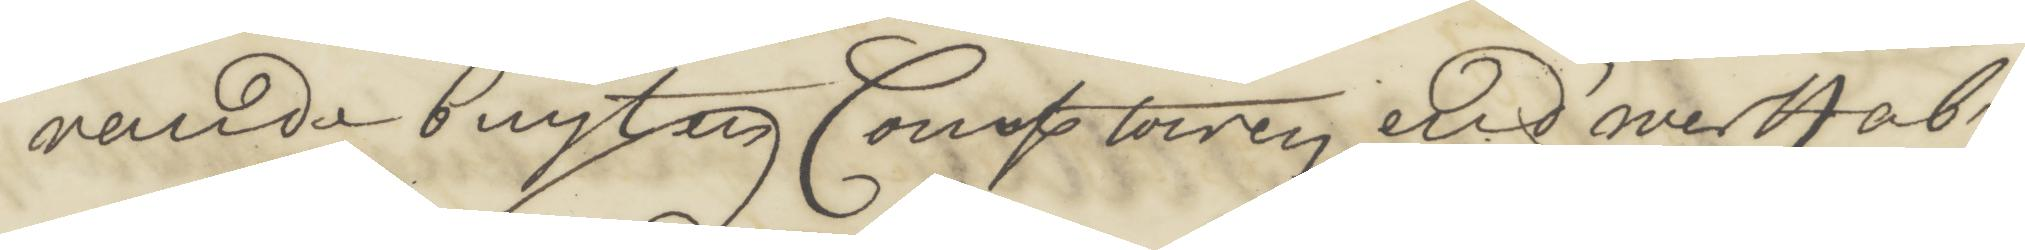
van de buyten Comptoiren end’wertf ab„
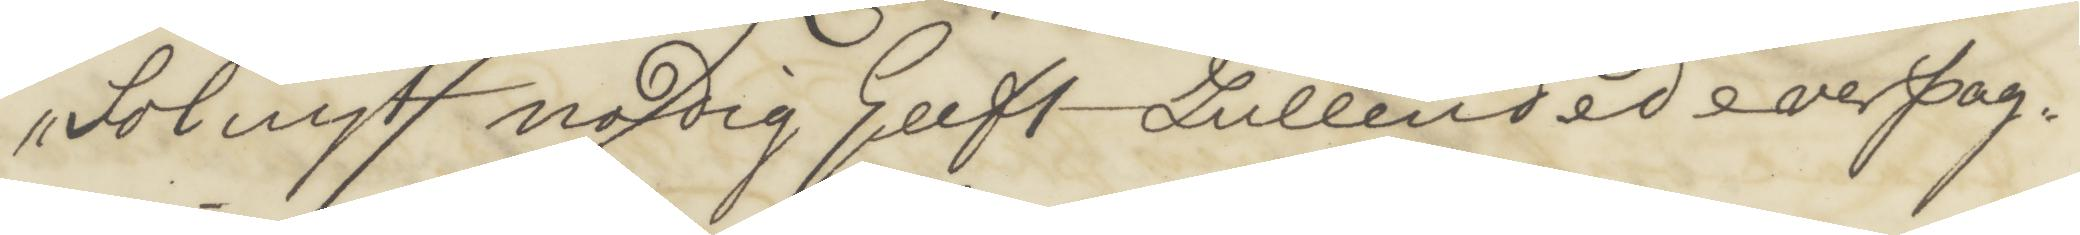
„soluijt nodig heeft zullendedeverpag„
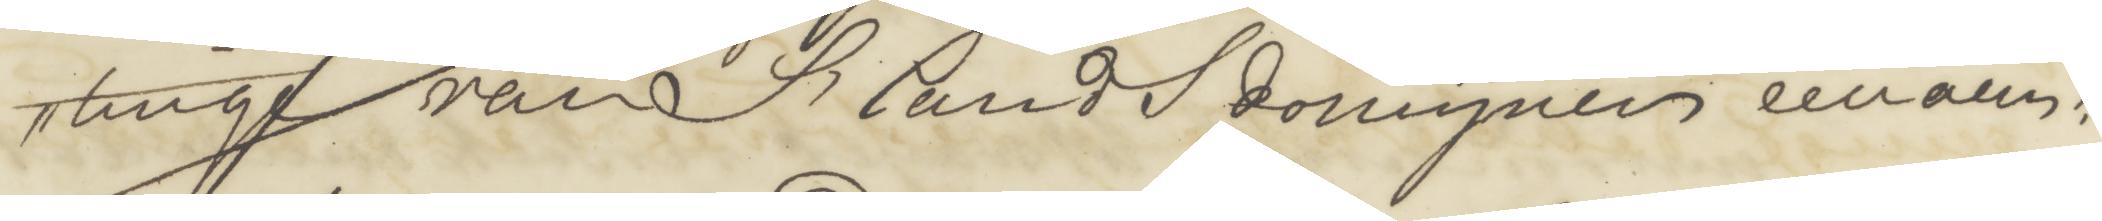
„tinge van S'lands domijnen een aan:
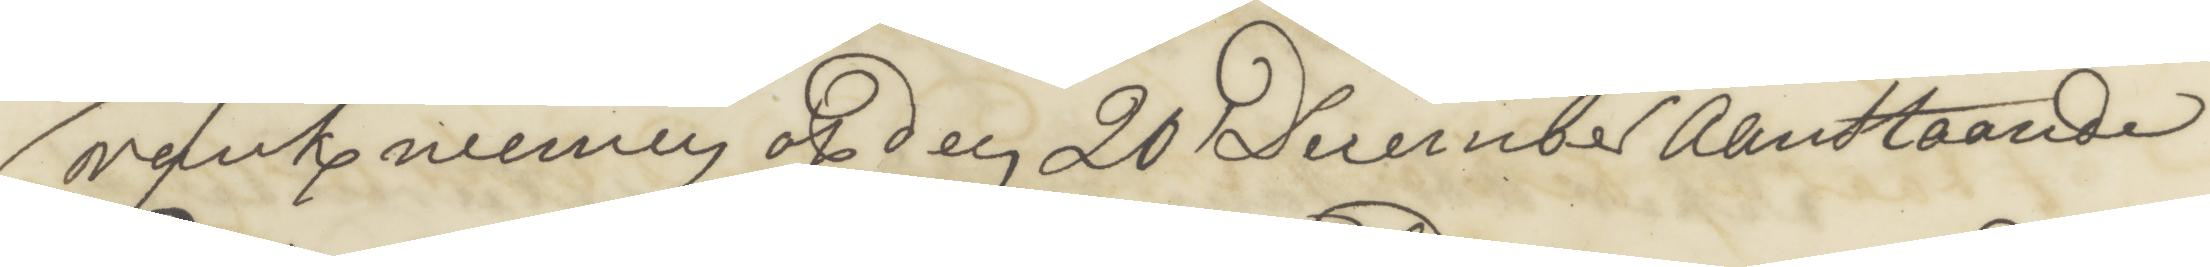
vank neemen op den 20 December Aanstaande
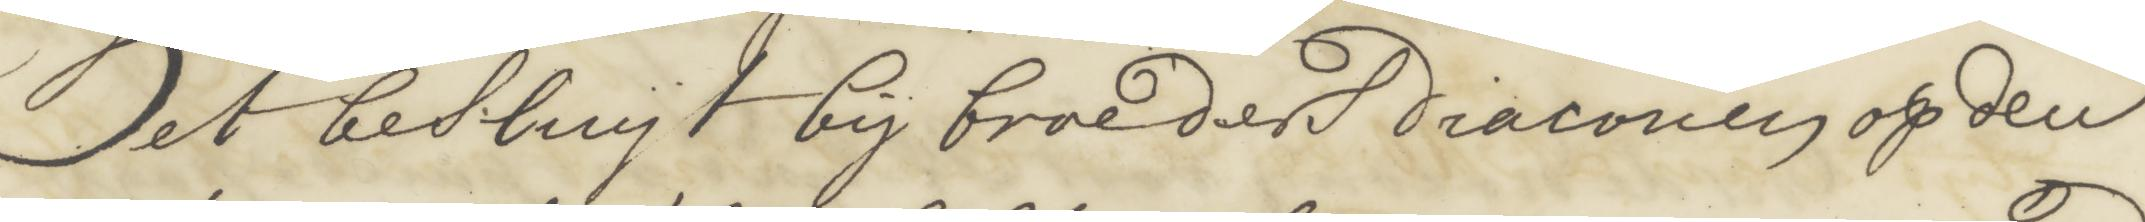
Het besluijt bij broeders diaconen op den
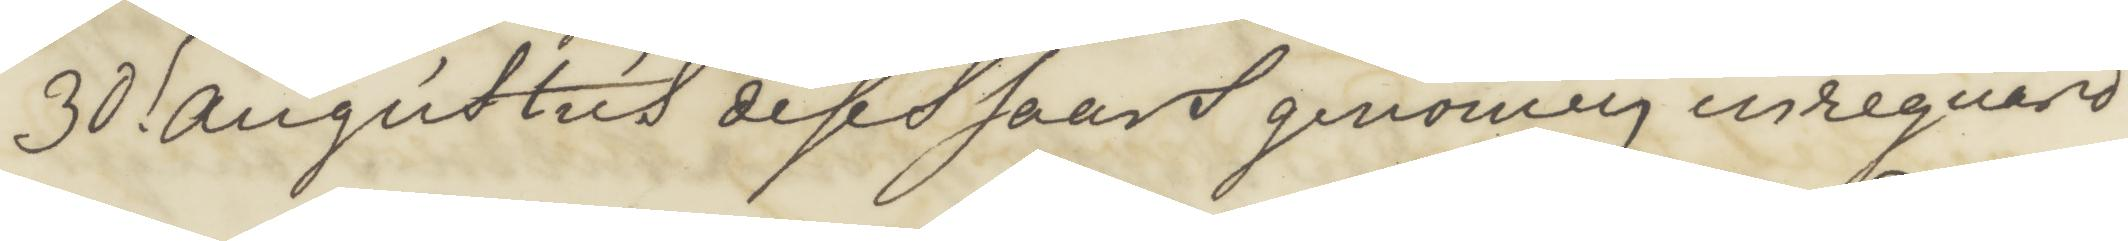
30:' augustus deses jaars genomen in reguard
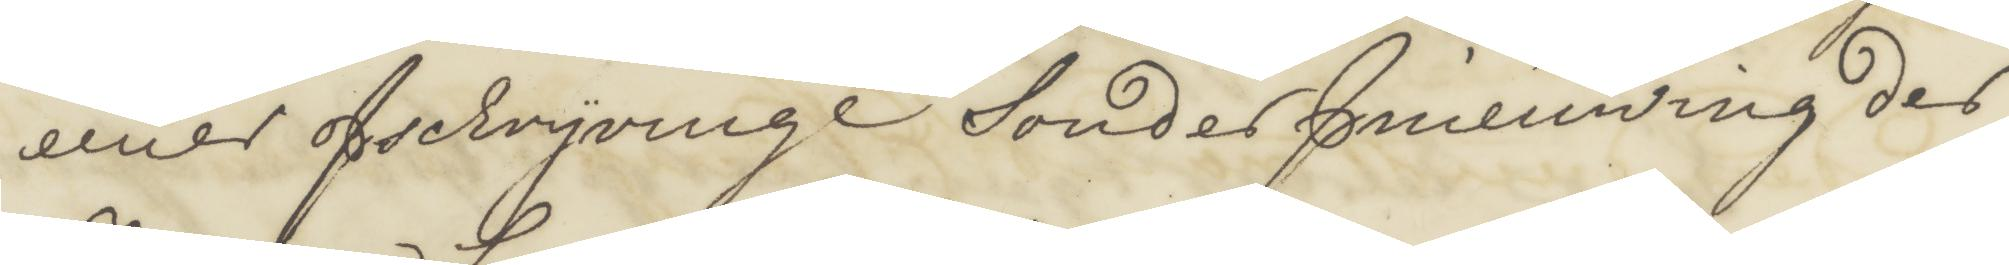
eener overschrijvinge sonder vernieuwing des
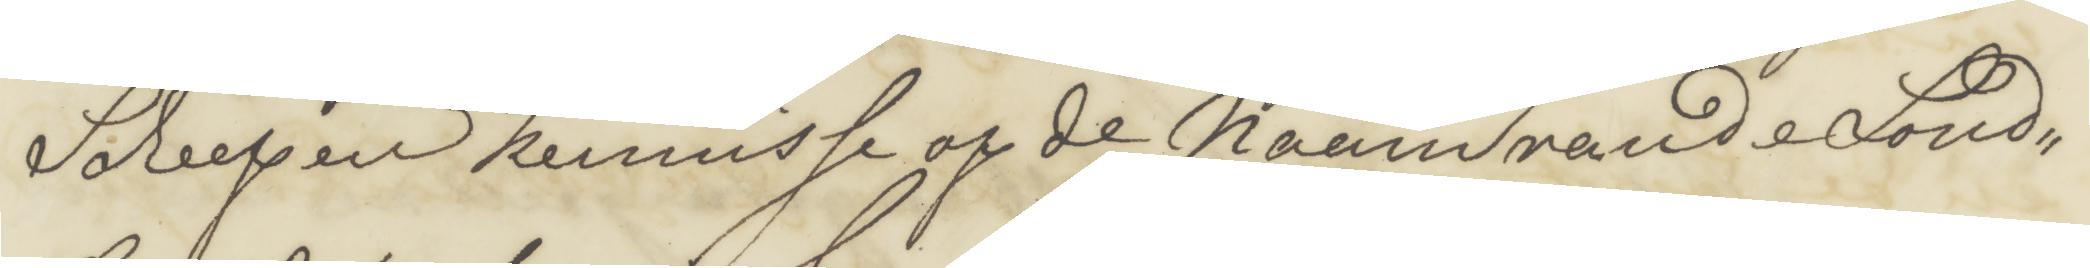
scheepen kennisse op de naam van de Loud„
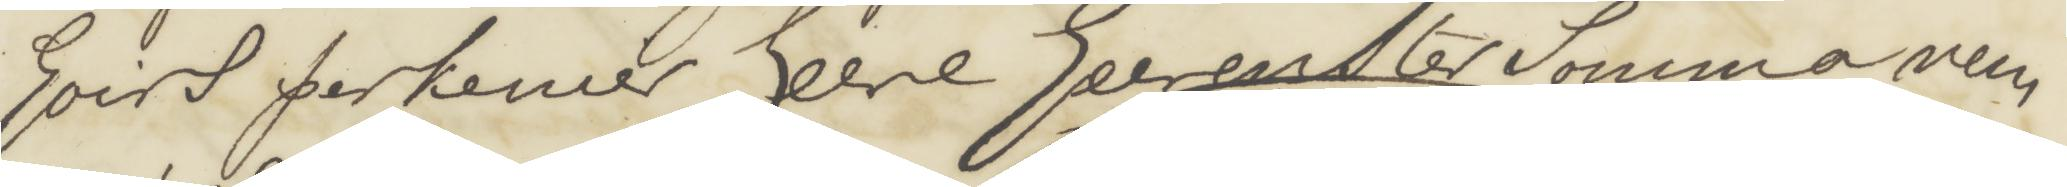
hoirs perkenier Heere Heerens ter somma van
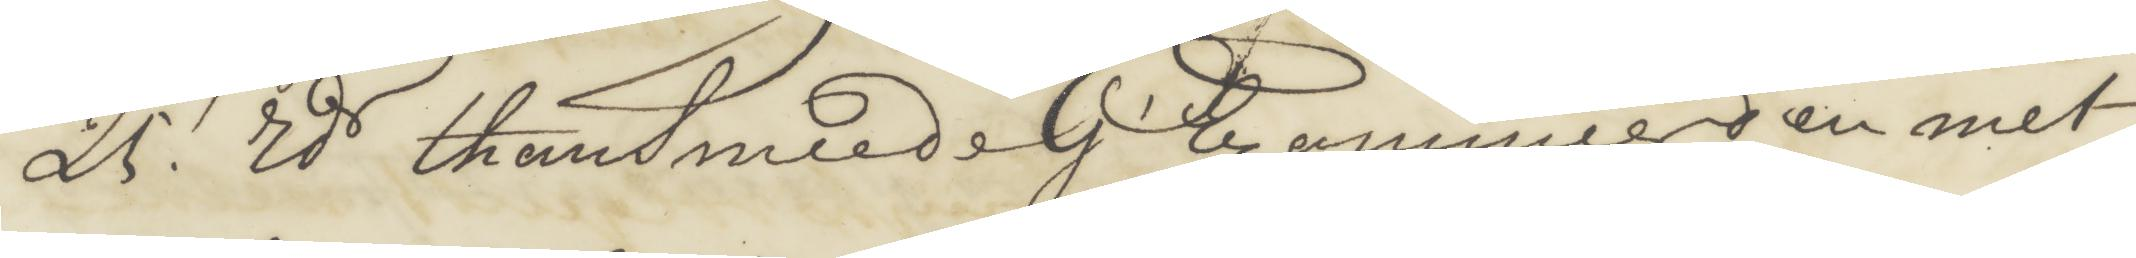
25.' rd.s thans meede G' Examineerd en met
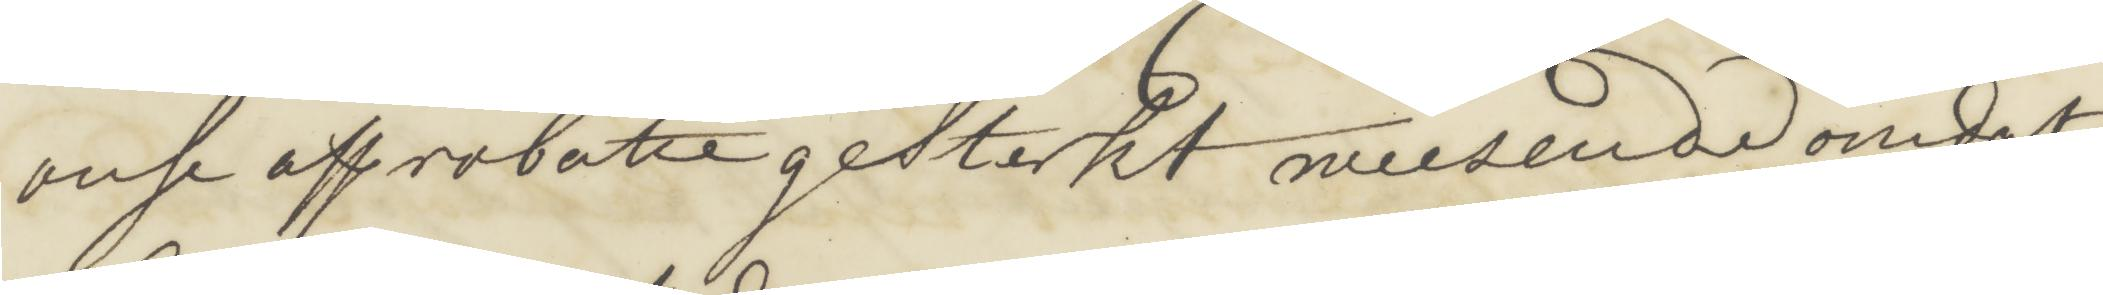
onse approbatie gesterkt weesende om dat
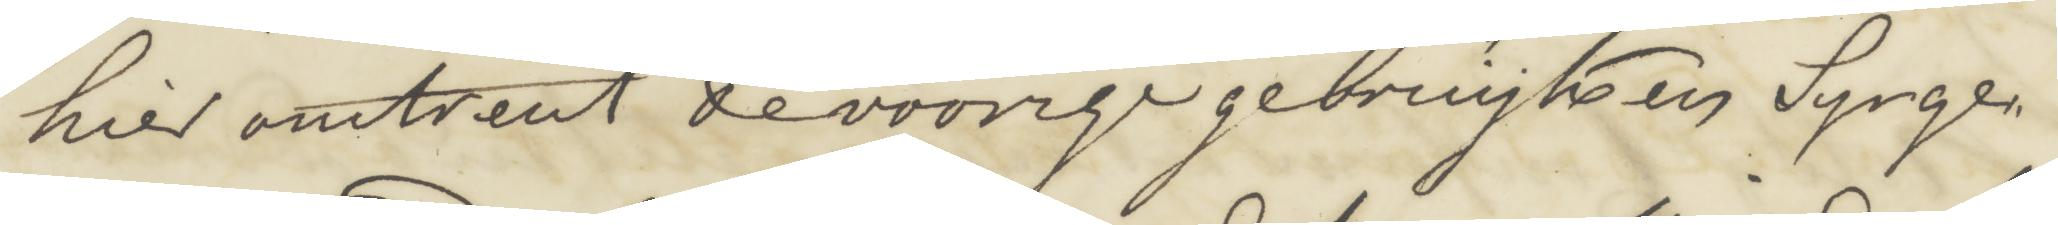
hier omtrent devoorige gebruijk en syrge„
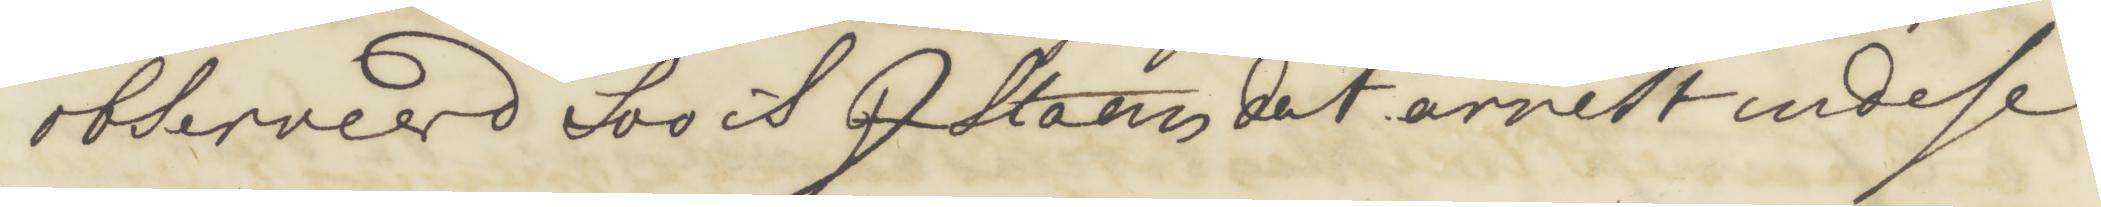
observeerd soo is gestaan dat arrest indese
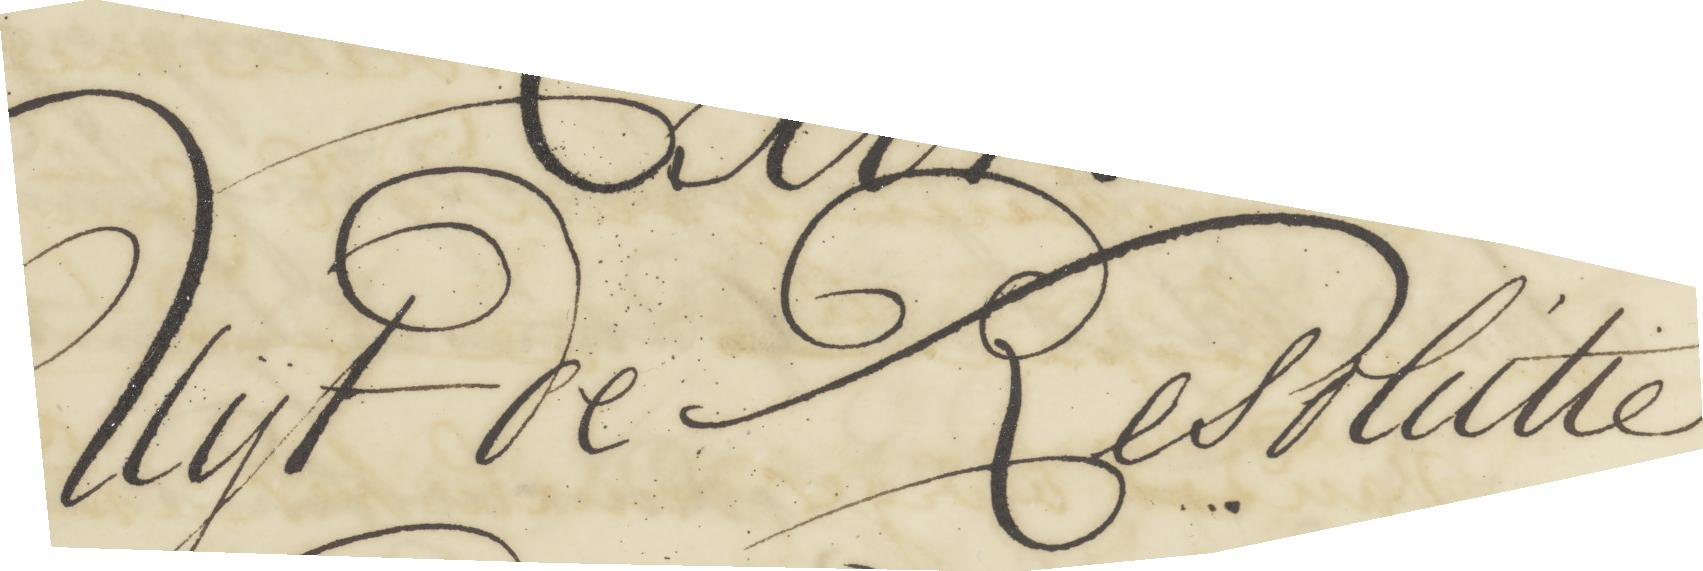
Uijt de Resolutie
